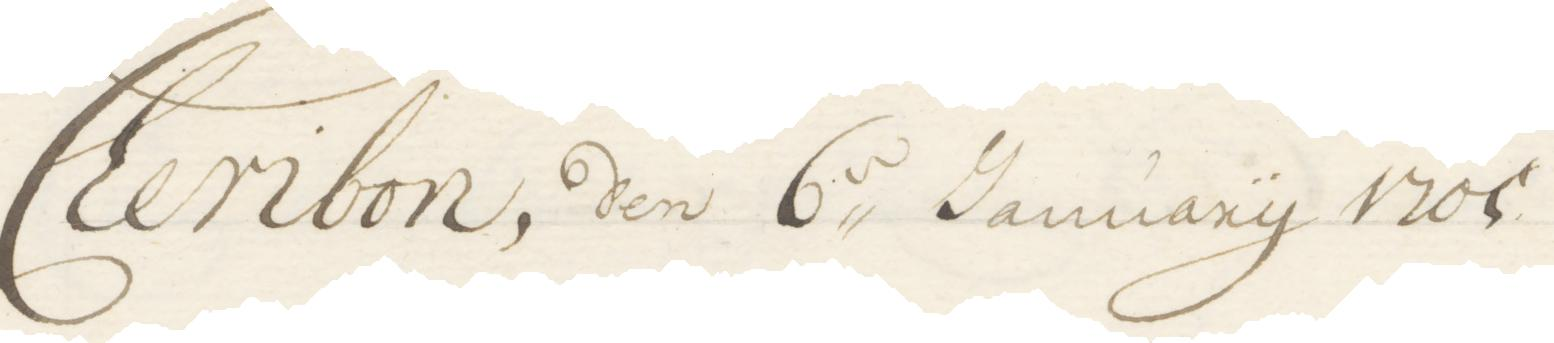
Charibon, den 6:en Januarij 1705.
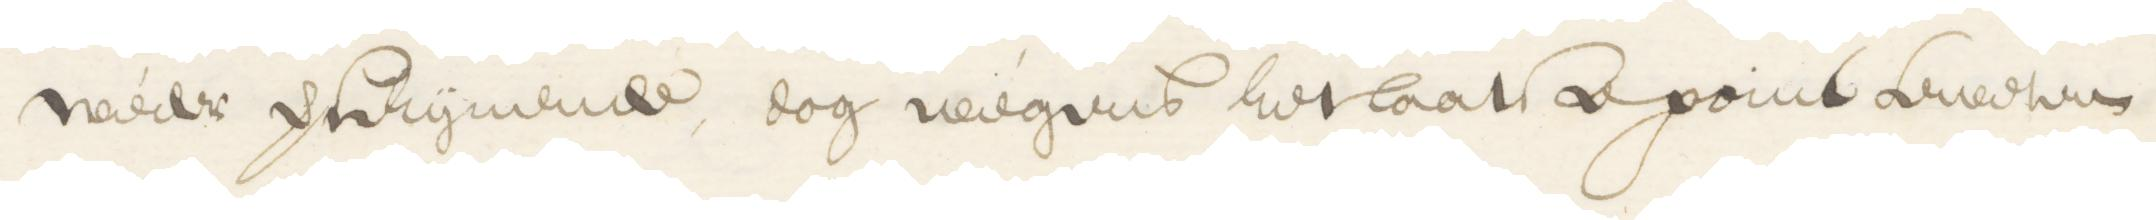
weder verschijnende, dog wegens het laatste point teweten
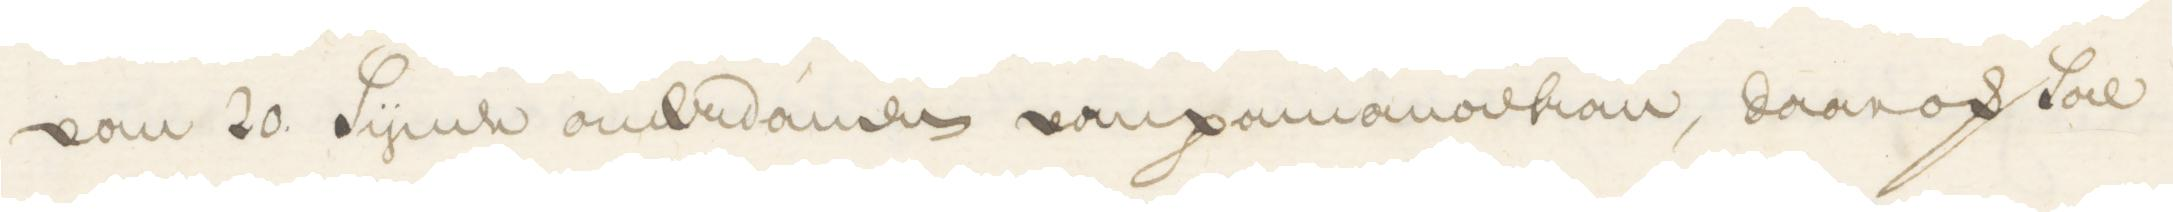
van 20 sijner onderdanen van pamanoekan, daar over sal
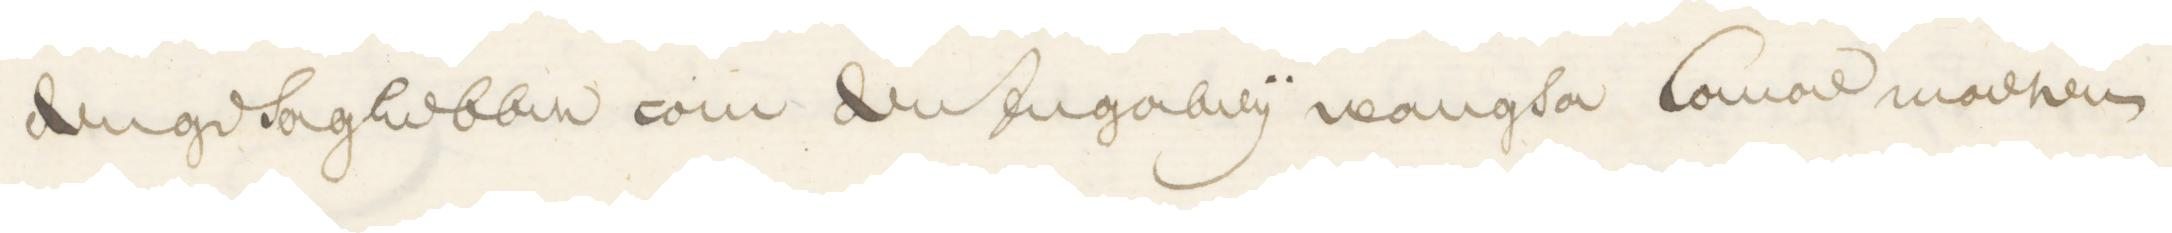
den gesaghebber com den Ingabeij wangsa tomoe moeten
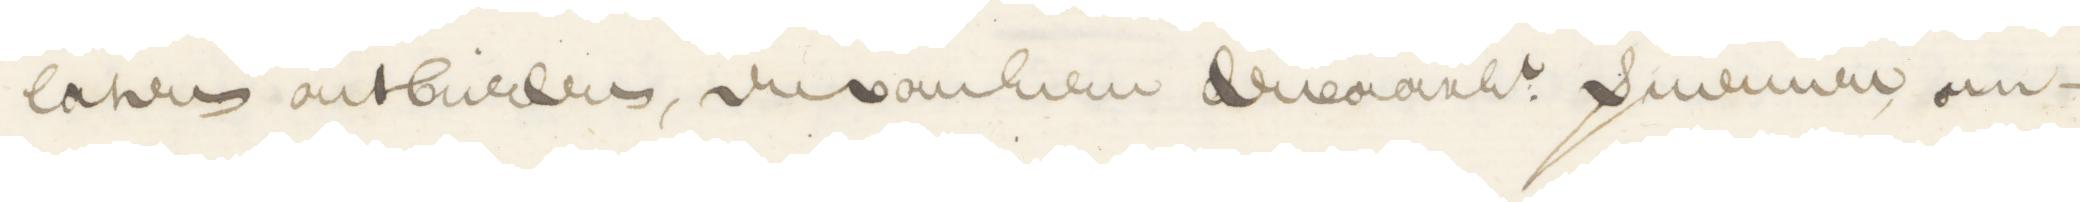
laten ontbieden, en van hen dewaarh:t vernemen, om
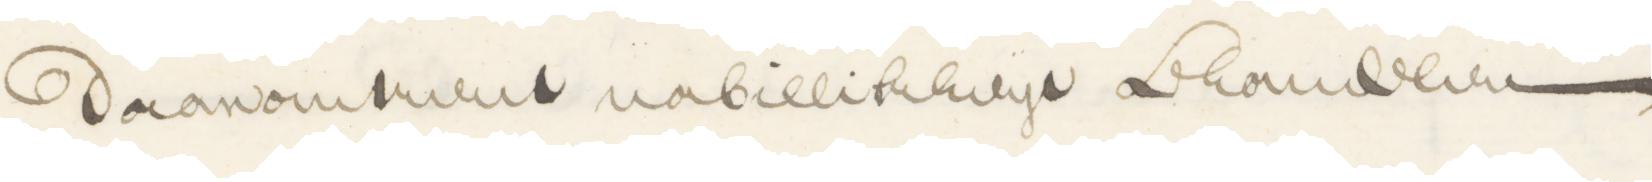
daaromtrent na billikheijt tehandelen
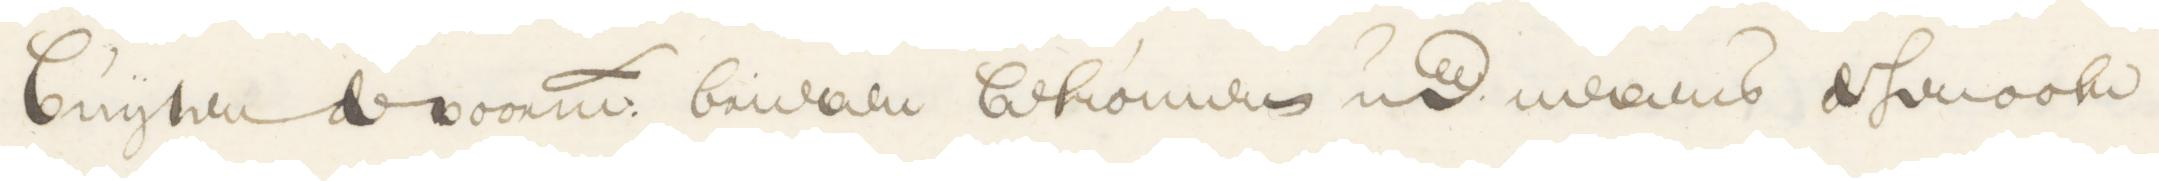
Buijten de voorm: brieven bekomen uE: nevens desen ook
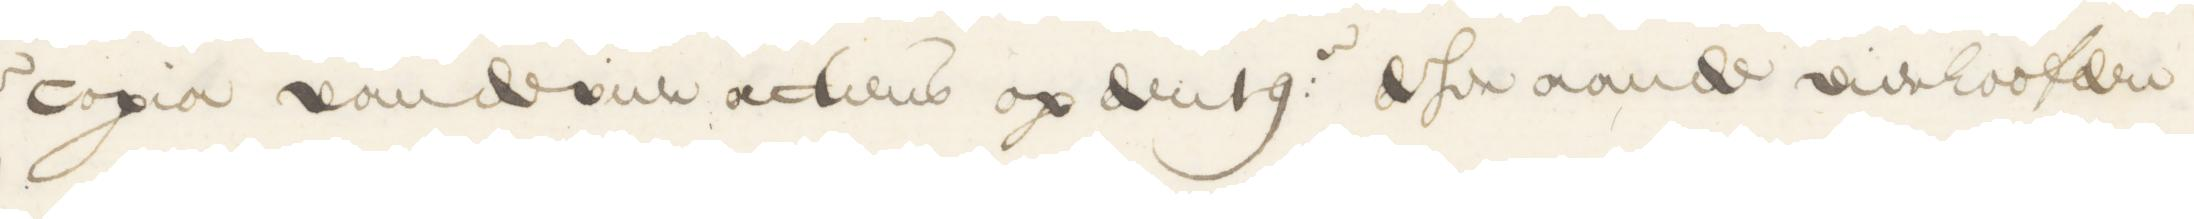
copia van de vier actens op den 19:en deser aan de vierhoofden
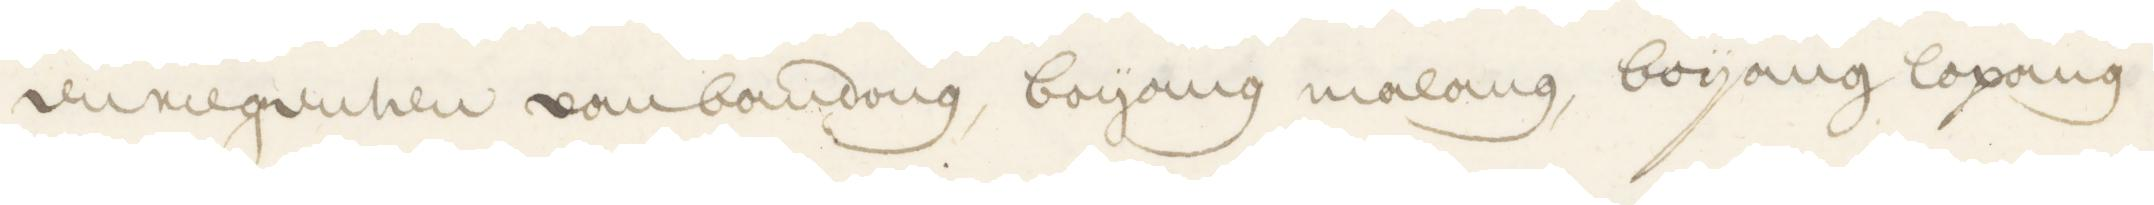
en regenten van bandong, boijong malang, boijang lopang
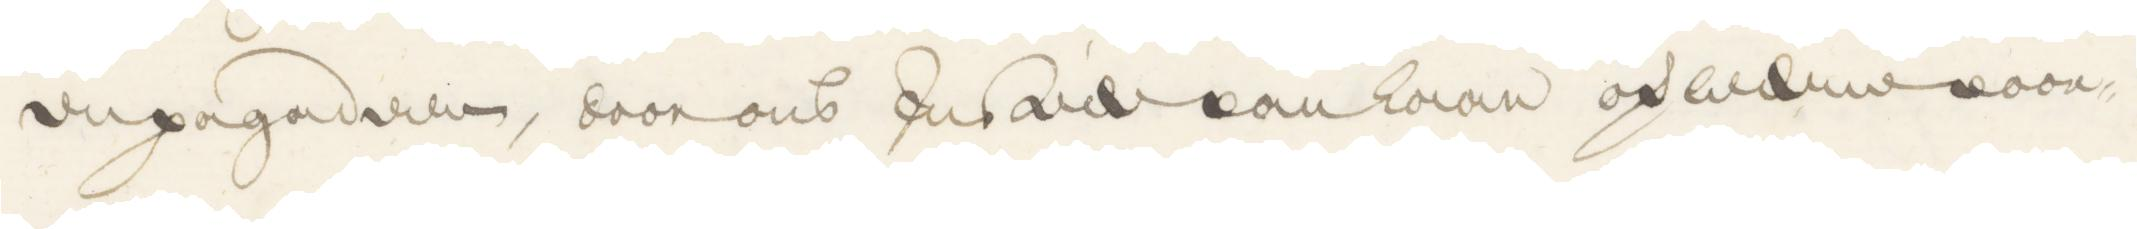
en pagadeen, door ons Instede van haar overledene voor„
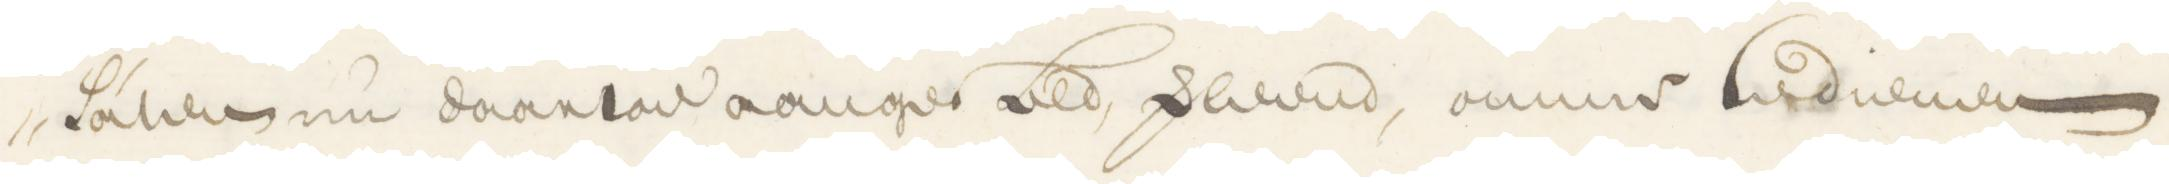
„saten nu daartoe aangesteld, verleend, omme te dienen
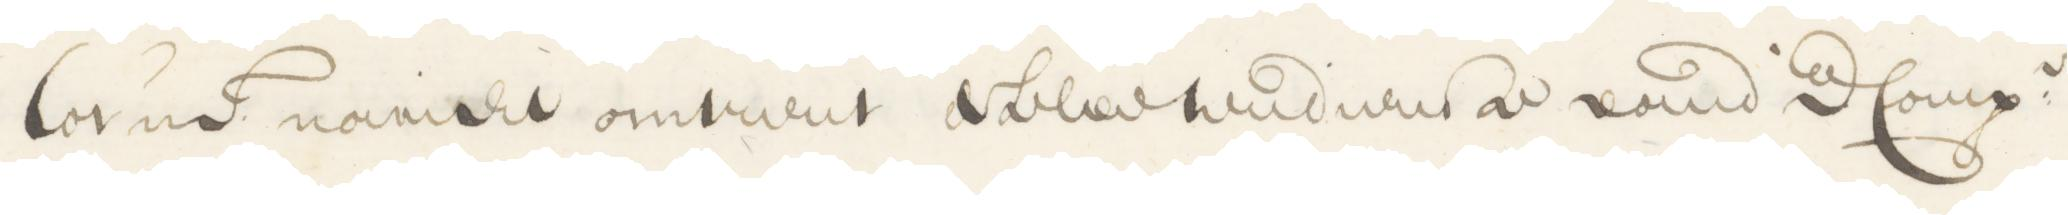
tot uE. naricht omtrent deselve ten dienste vand' E Comp:e
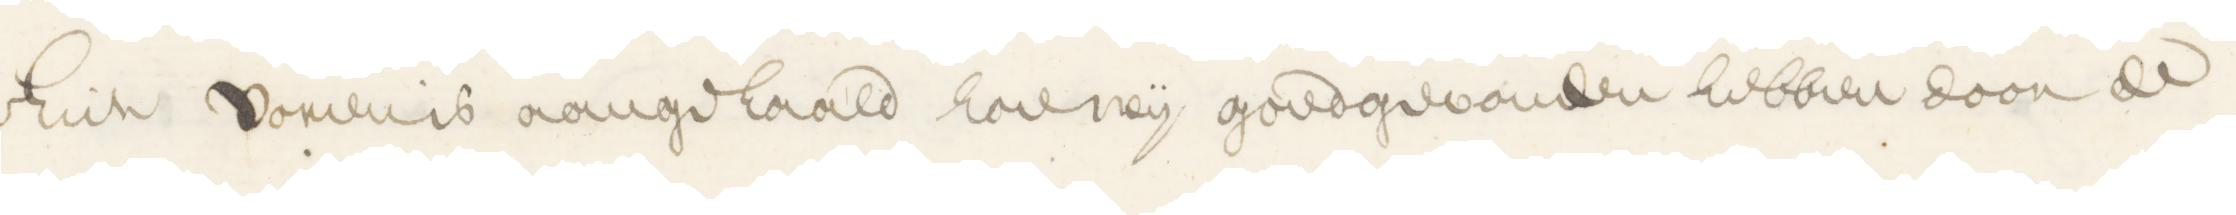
hier voren is aangehaald hoe wij goedgevonden hebben door de
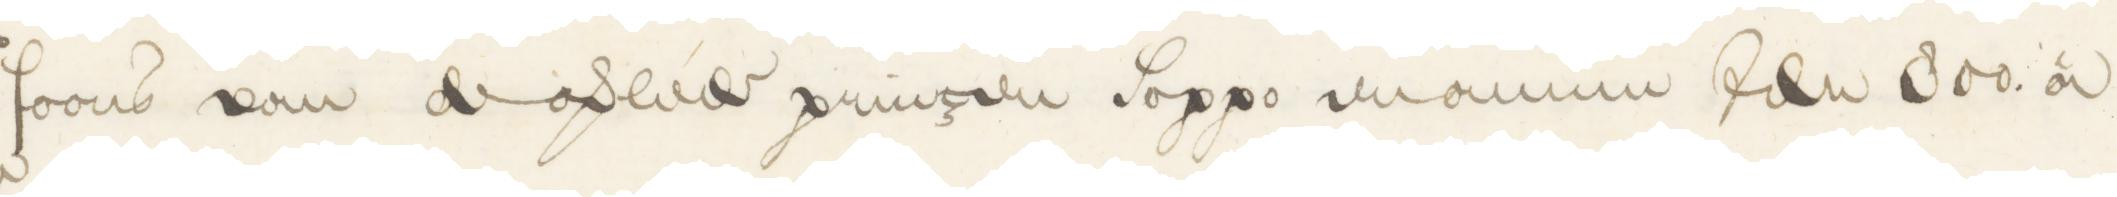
soons van de overlede prinçen soppo en amun Ider 800: à
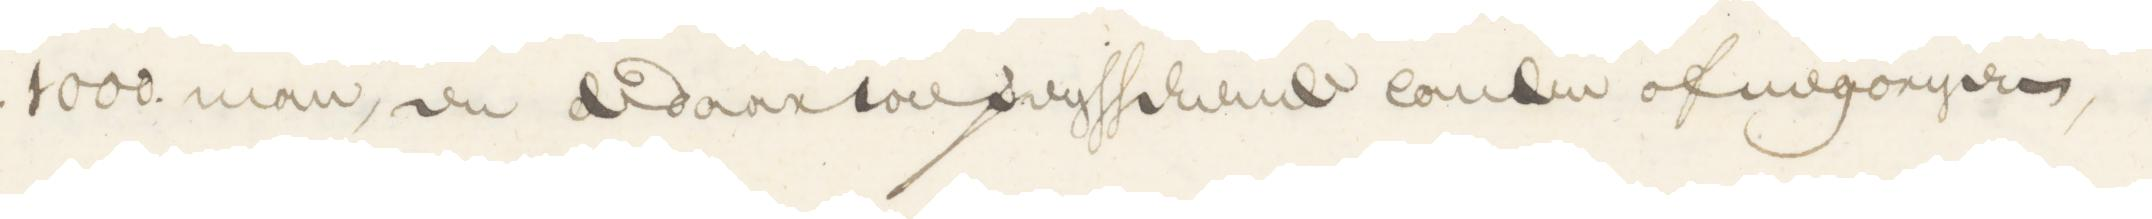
1000. man, en de daar toe vereijsschende landen of negorijen,
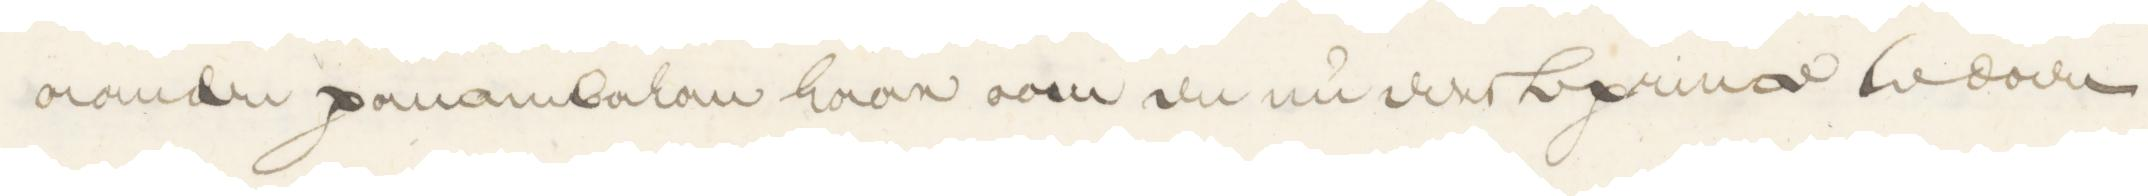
aanden panambahan haar oom en nu eerste prince te doen
